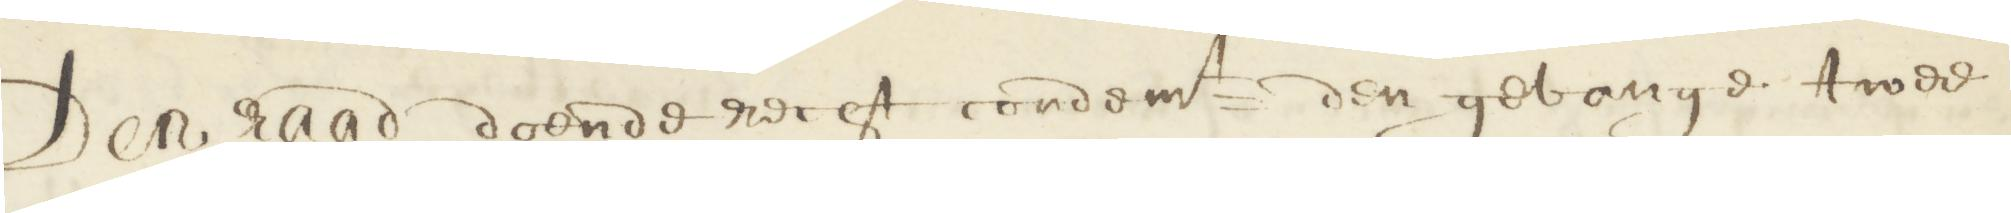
Den raad doende recht condem=t den gevange twee
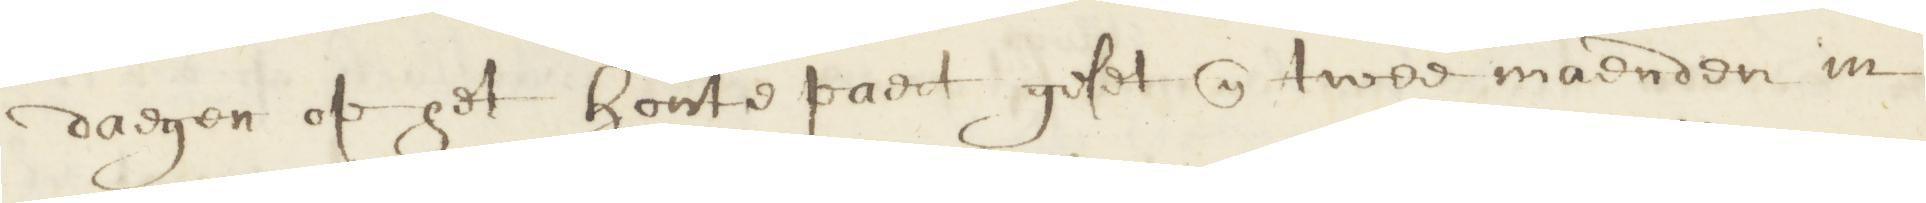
daegen op het houte paert geset ende twee maenden in
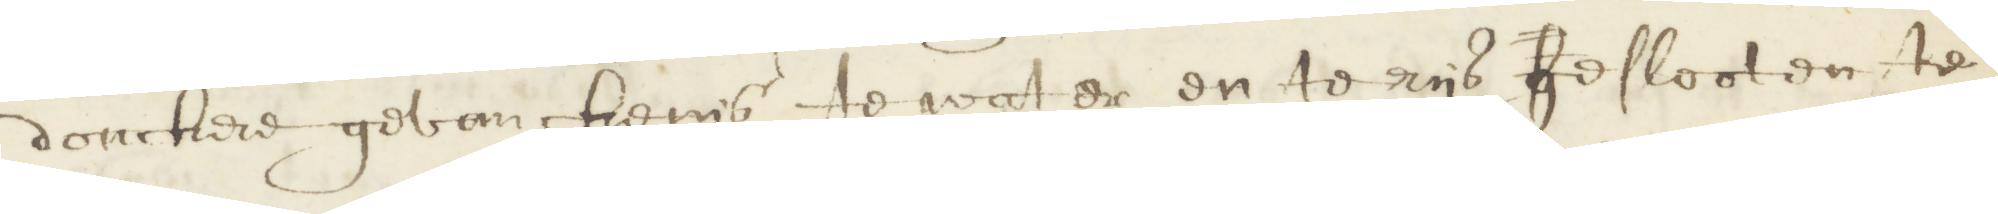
donckere gevanckenis te water en te rijs geslooten te
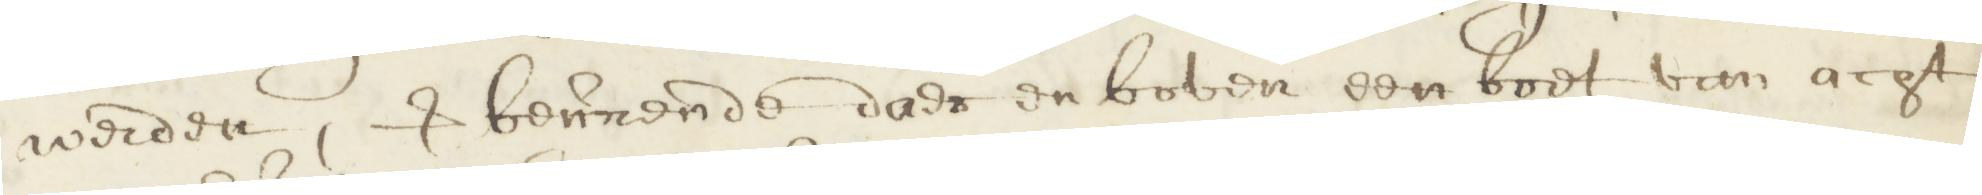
werden, verbeurende daer en boven een boet van acht
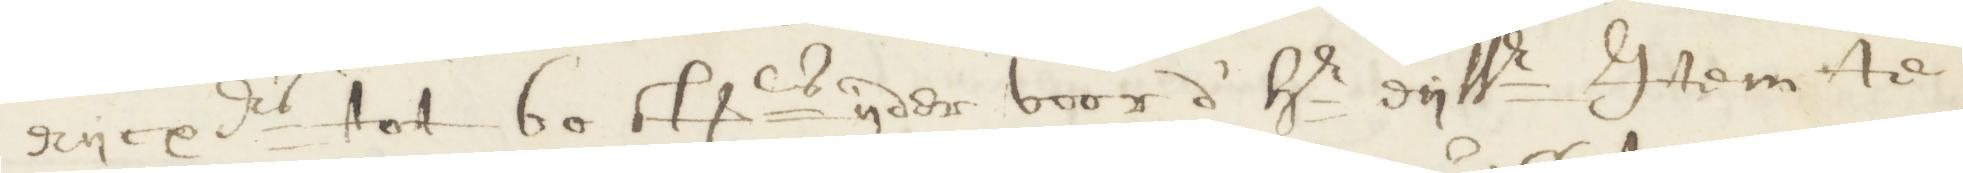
rijcxd=rs tot 60 stx=s ijder voor d’ h=r eijss=r Jtem: te
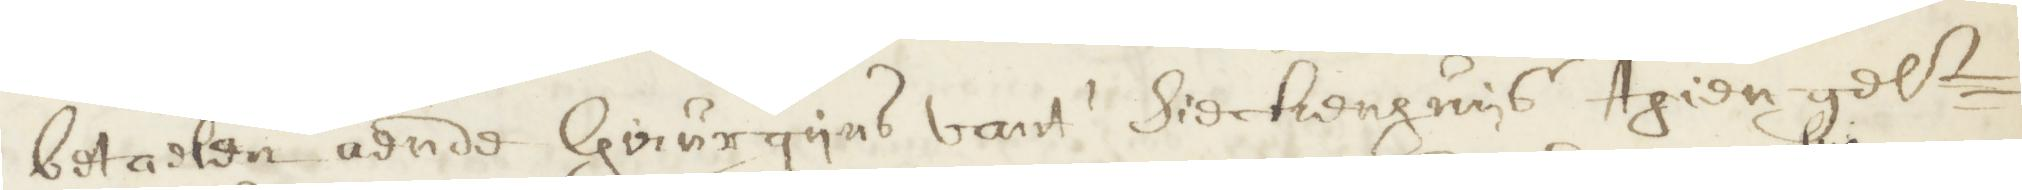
betaelen aende chirurgijns vant' sieckenhuijs thien gelijk
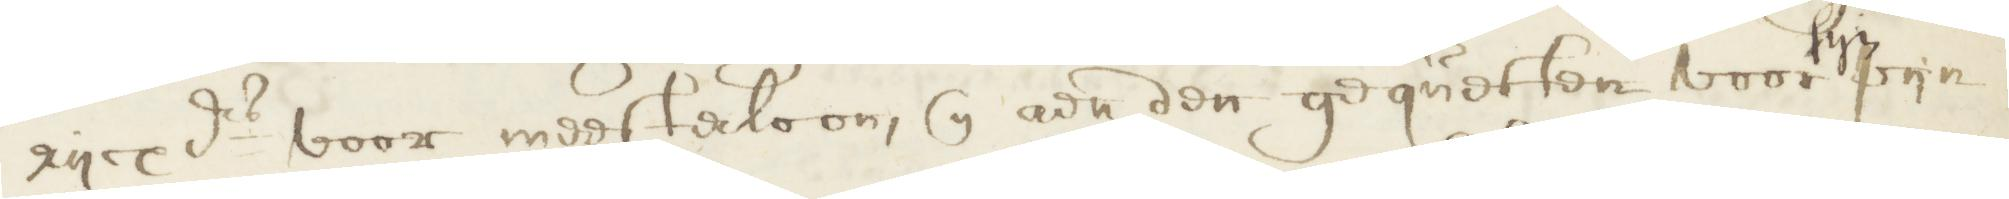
rijcxd=rs voor meesterloon, ende aen den gequesten voor zijn
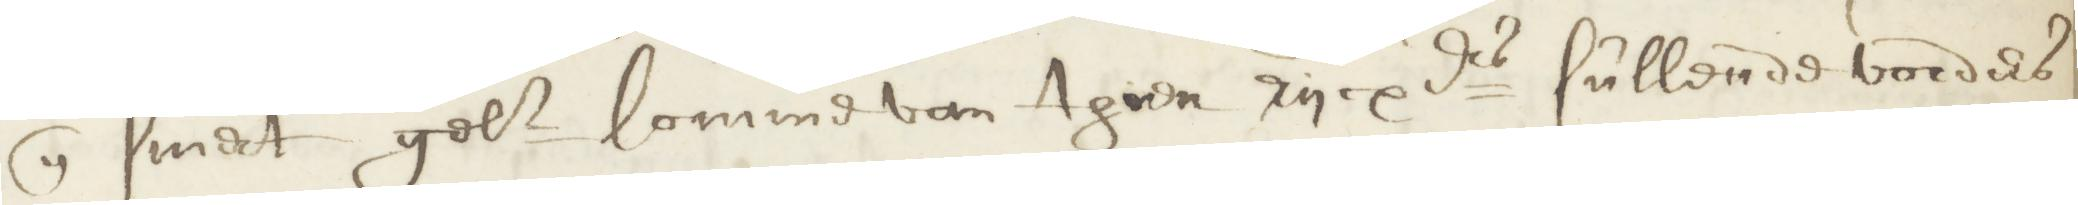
ende smert gelijk somme van thien rijcxd=rs sullende vorders
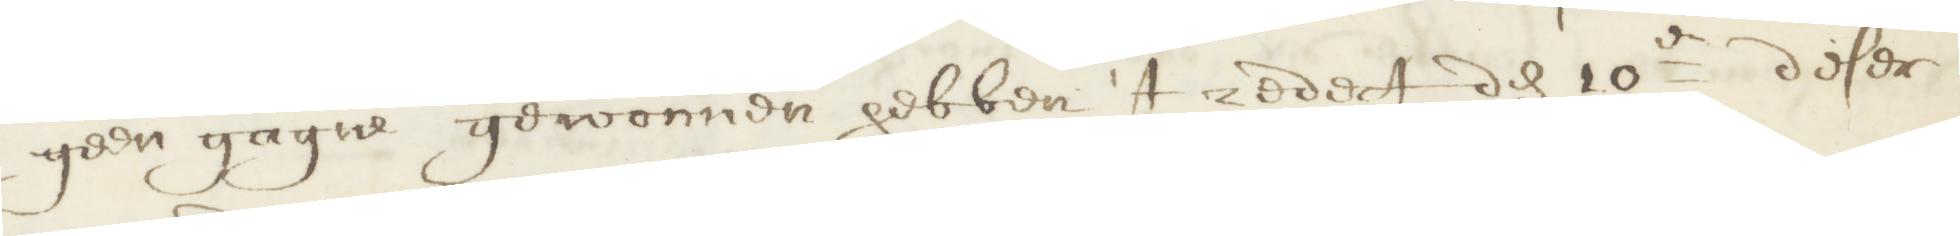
geen gagie gewonnen hebben ’t zedert den 10=e deser
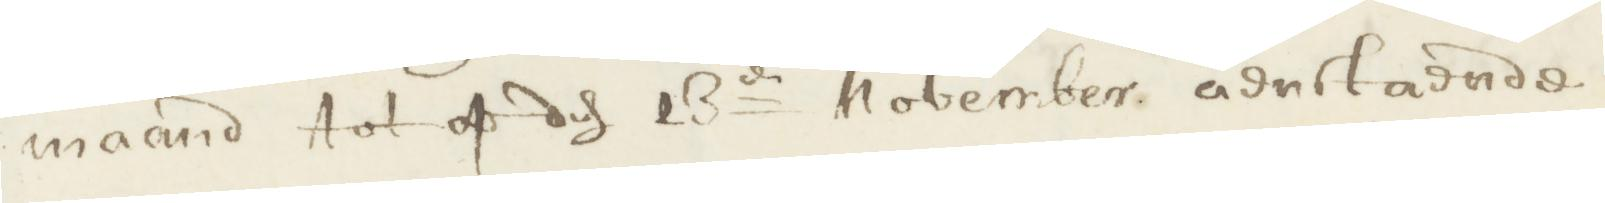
maand tot op den 23=en November aenstaende
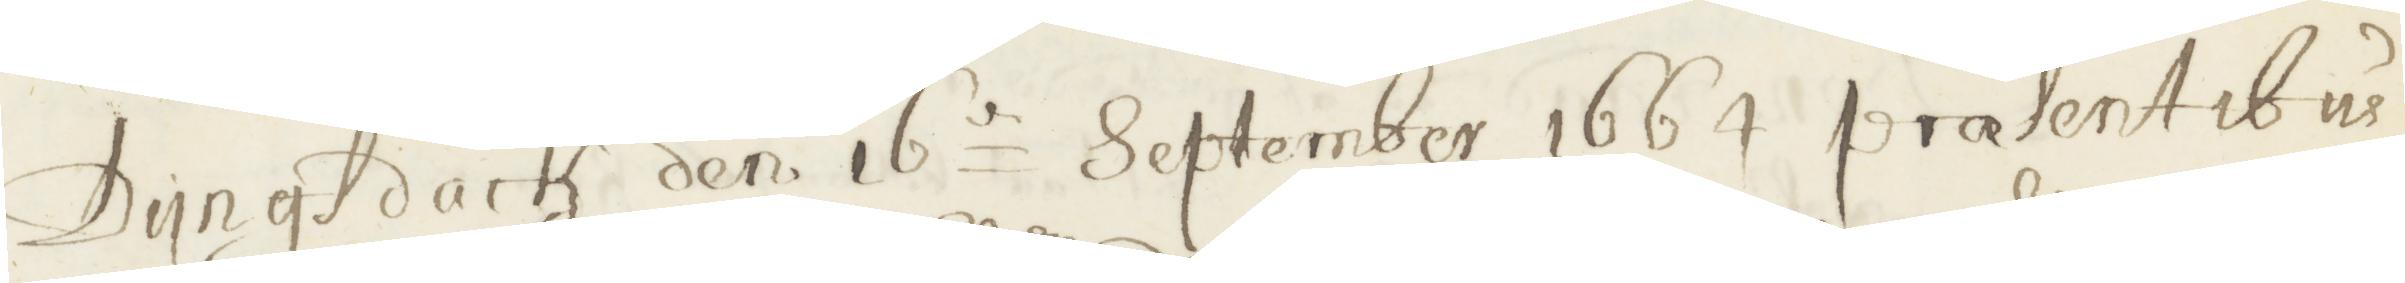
Dijngsdach den 16=e September 1664 prasentibus
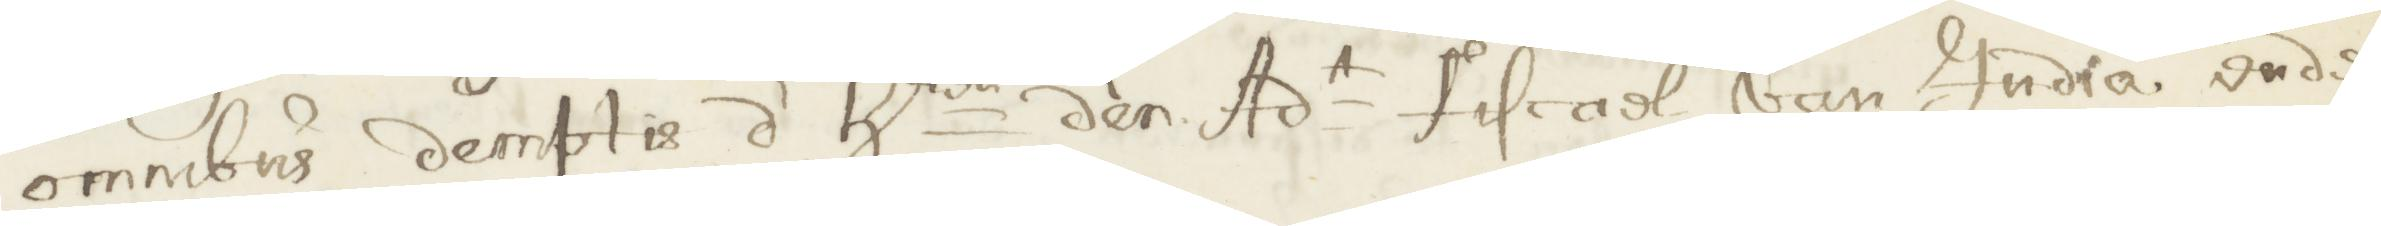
omnibus demptis d’ h=ren den Ad=t fiscael van Jndia ende
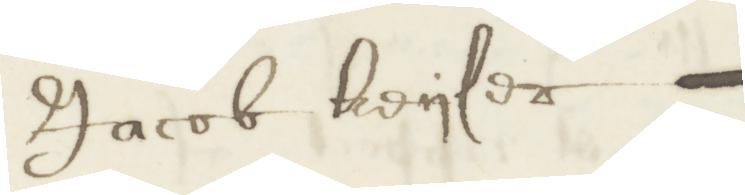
Jacob keijser—
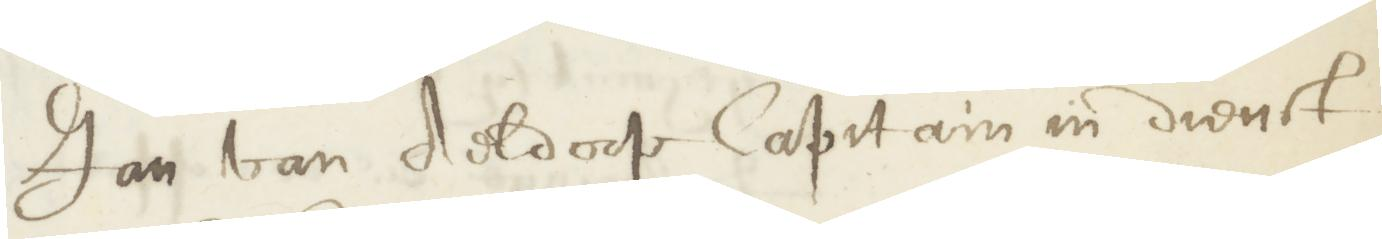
Jan van Aeldorp Capitain in dienst
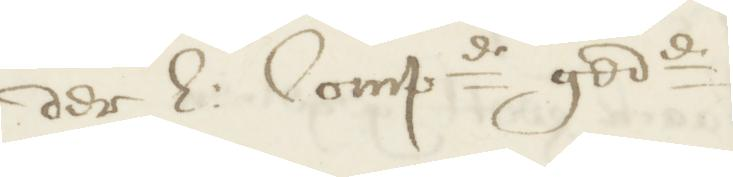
der E: Comp=e ged=e
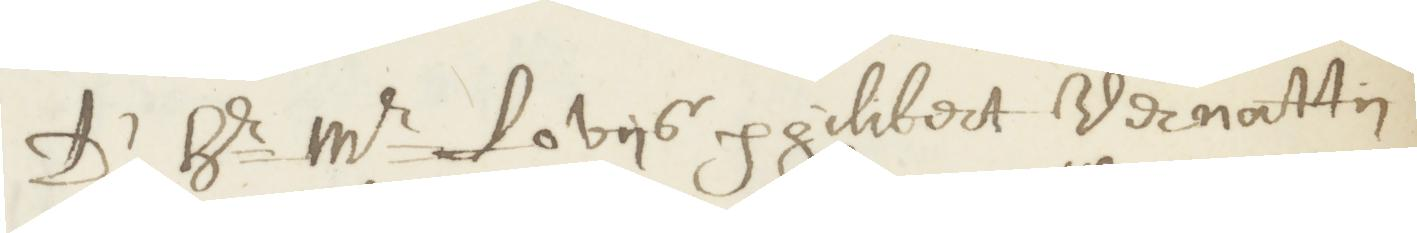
D H=r M=r Lovijs philibert Vernattij
